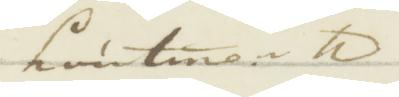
houtwerk
